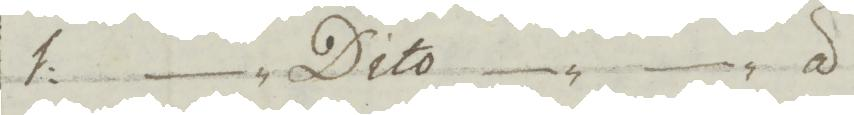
1: —„ Dito —„ —„ a
